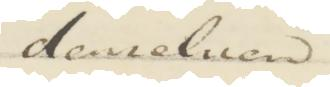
dencelven
